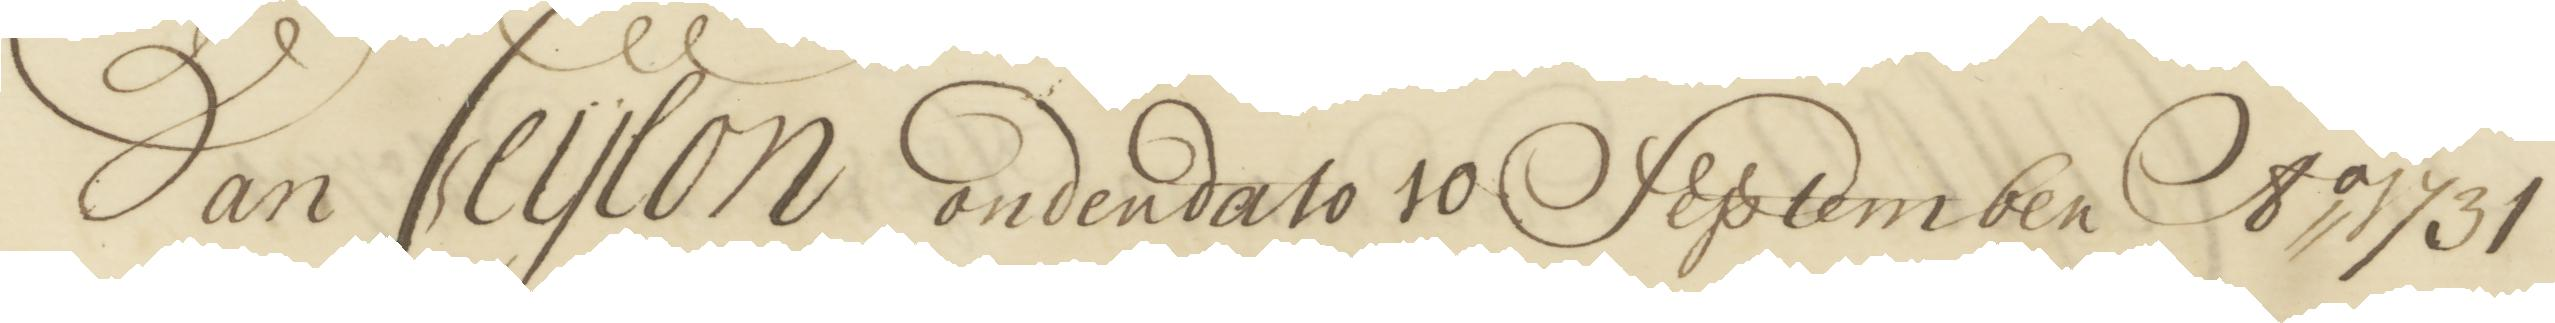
Van Ceijlon onder dato 10 September A„o 1731
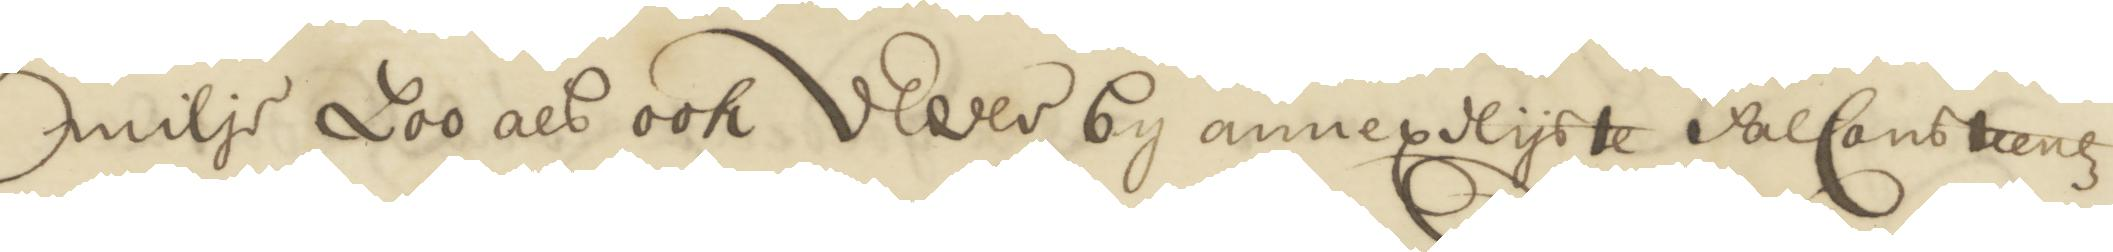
milje Zoo als ook VEdele by annexe lijste sal Consteeren
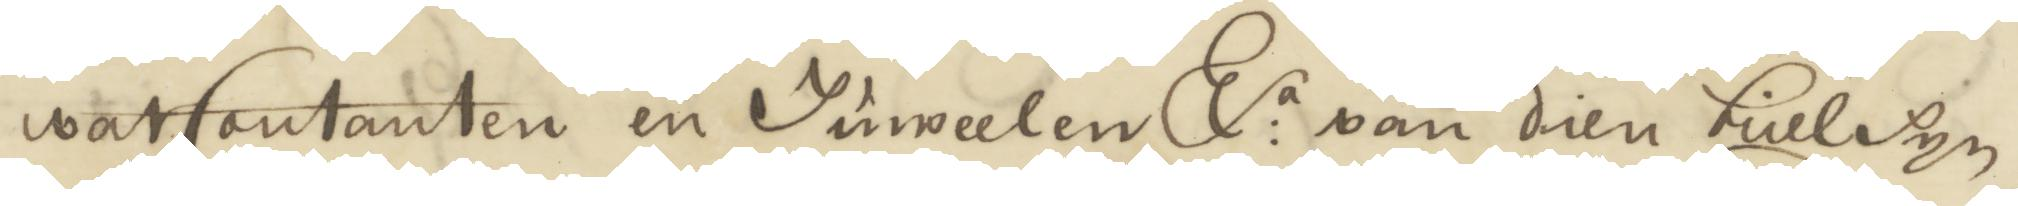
wat Contanten en Iuweelen &:a van dien kiel syn
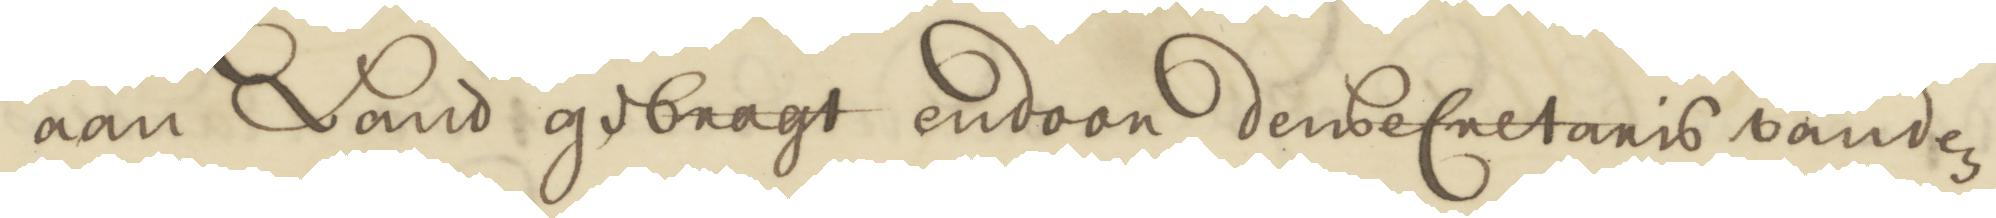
aan Land gebragt en door den secretaris van den
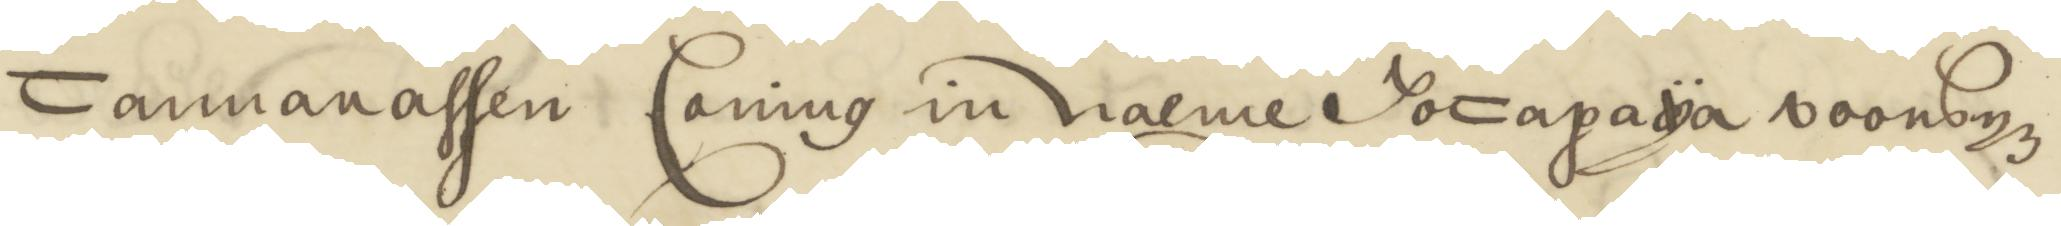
Cannarassen Coning in naeme Iocapaija voor syn
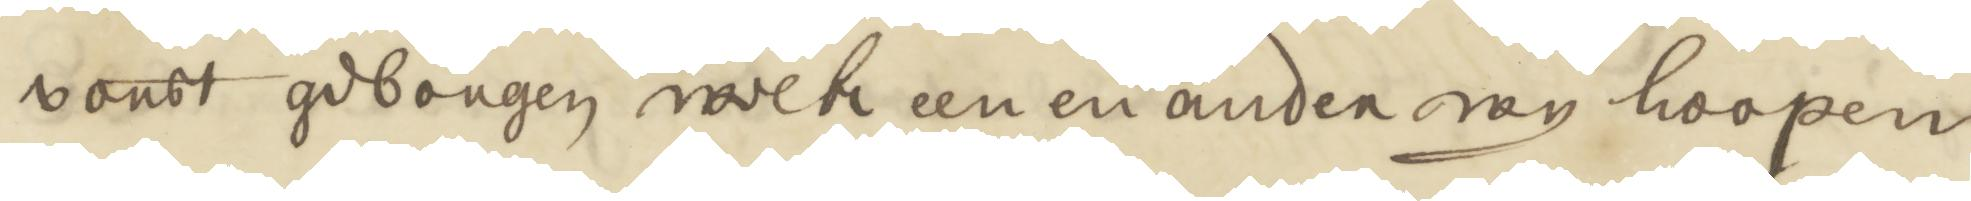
vorst geborgen welk een en ander wy hoopen
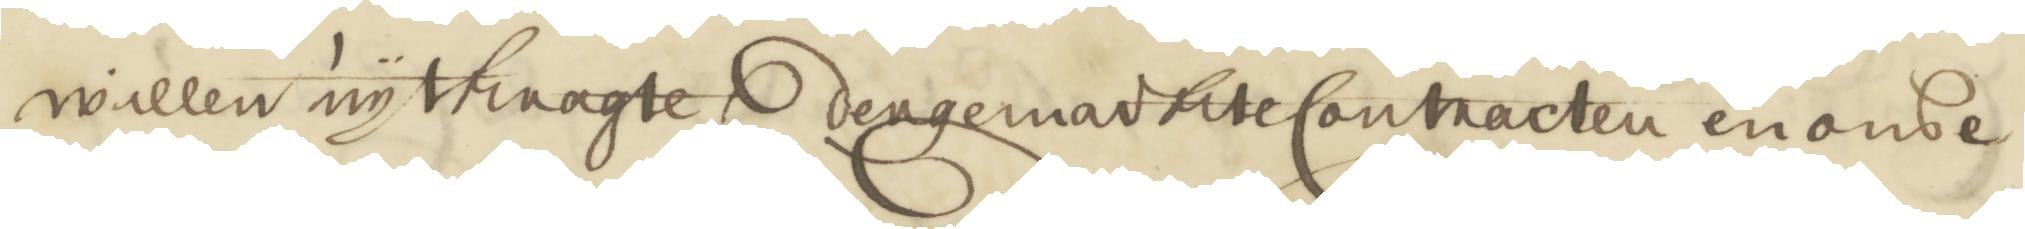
willen uijt kragte der gemaekte Contracten en onse
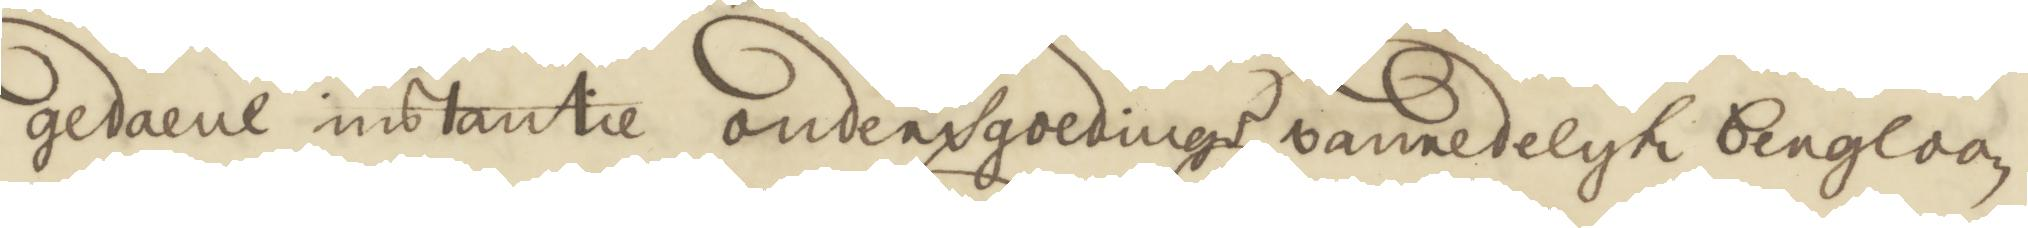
gedaene instantie onder vergoedinge vanredelyk bergloon
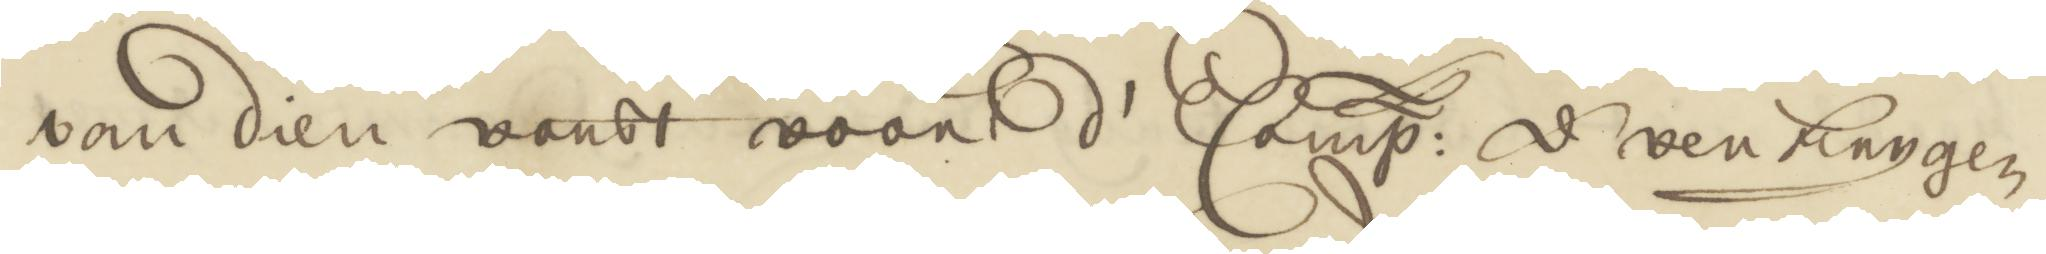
van dien vorst voor d’EComp: te verkrygen
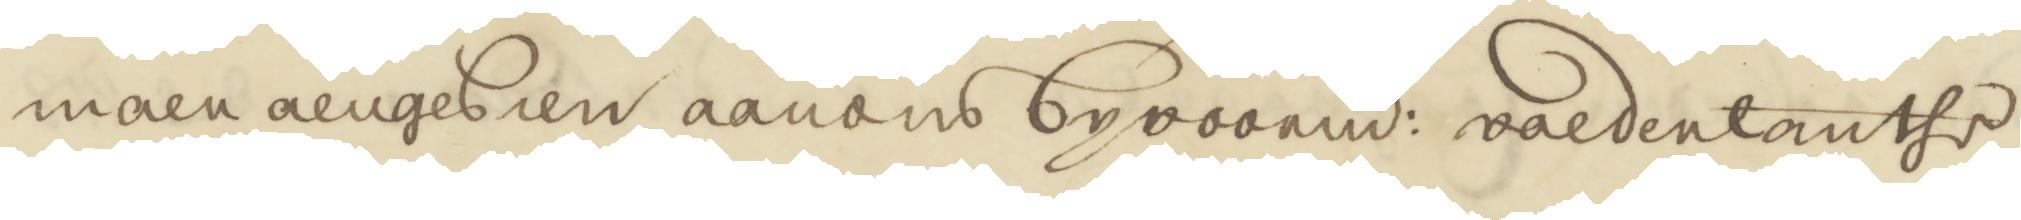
maer aengesien aan ons by voorm: vaederlantse
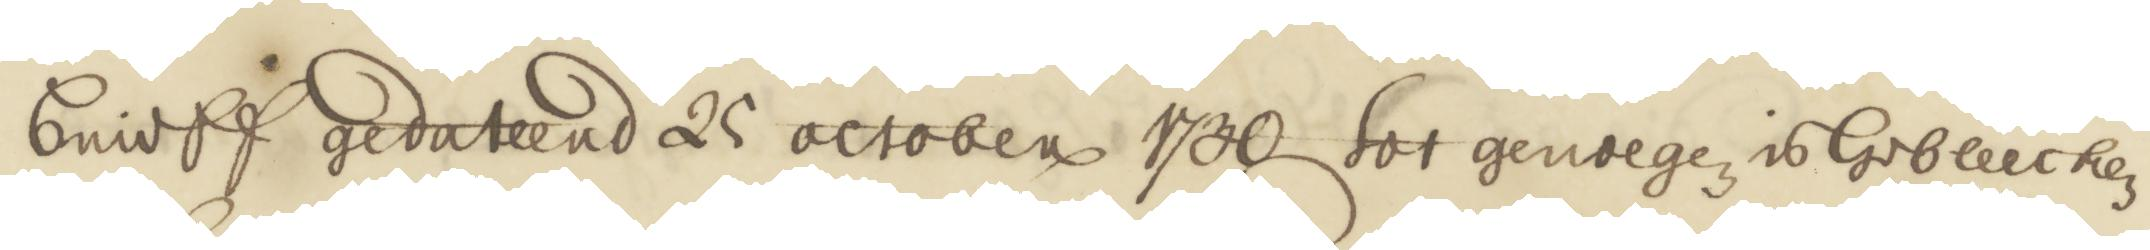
brieff gedateerd 25 october 1730 tot genoegen is gebleecken
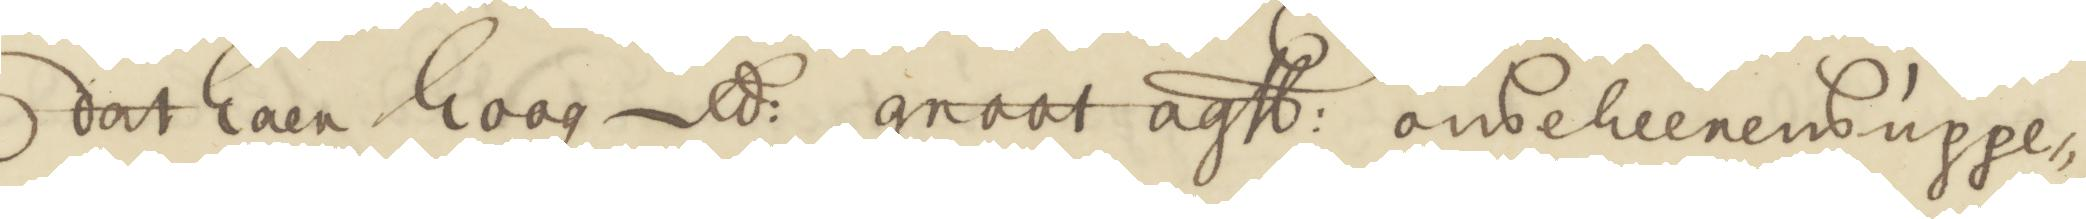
dat haer hoog Ed: groot agtb: onse heeren suppe„
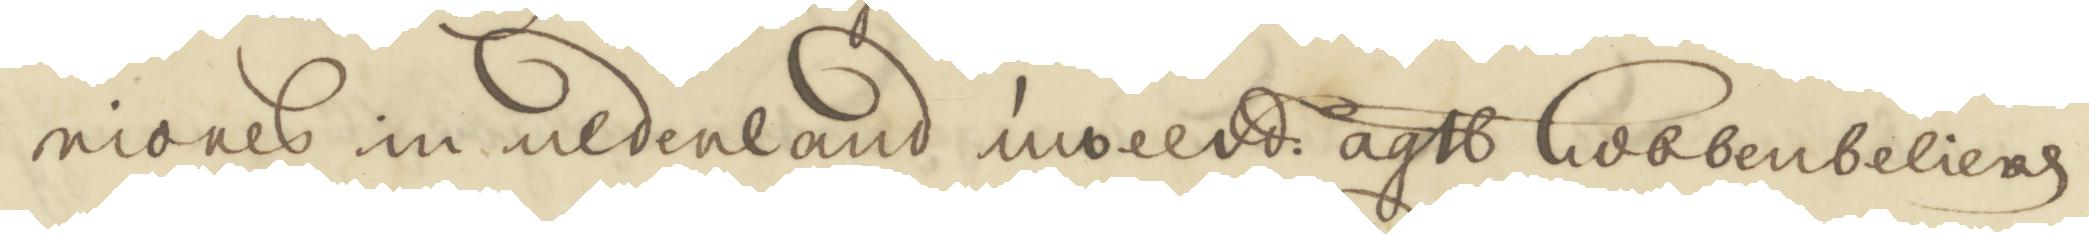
riores in nederland uwel Ed: agtb hebben believen
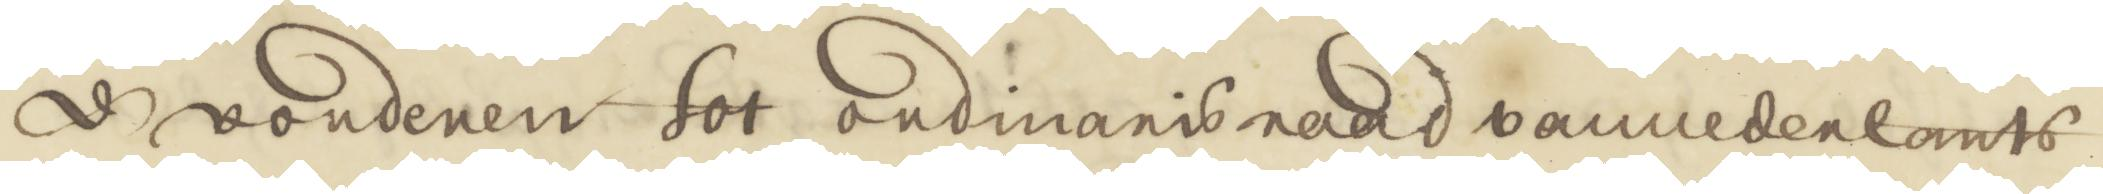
te vorderen tot ordinaris raad van nederlants
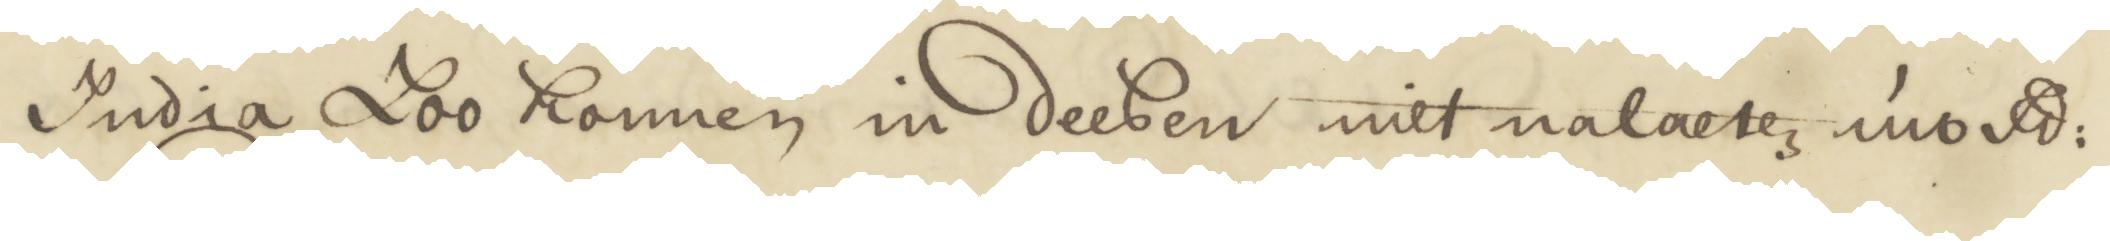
India Zoo konnen in deesen niet nalaeten uw Ed:
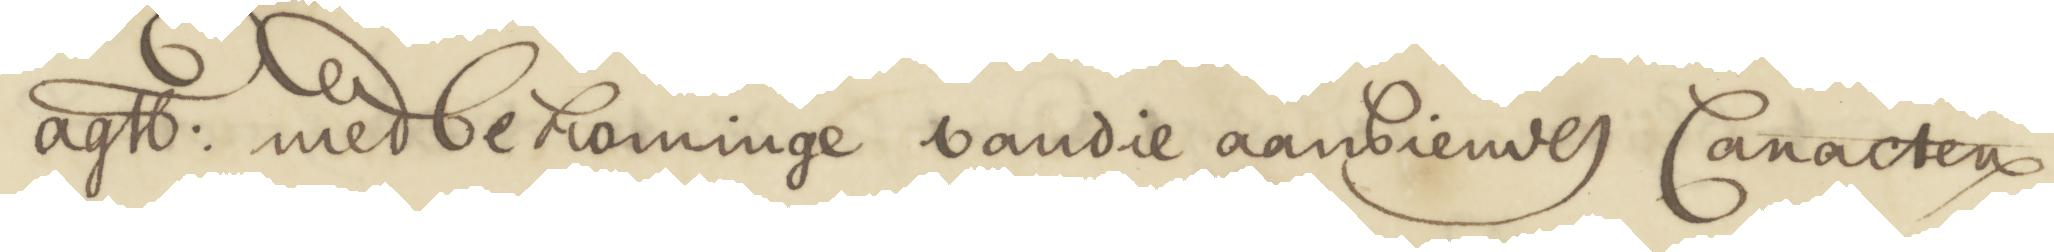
agtb: med bekominge van die aansienelijke Caracter
